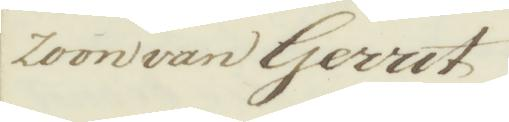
zoon van Gerrit
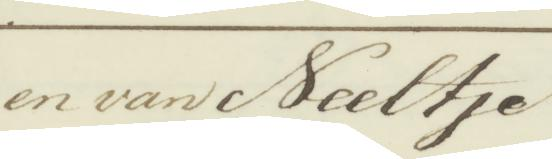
en van Neeltje
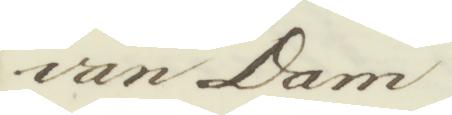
van Dam
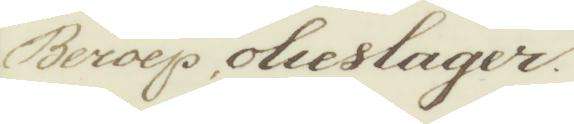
Beroep, olieslager.
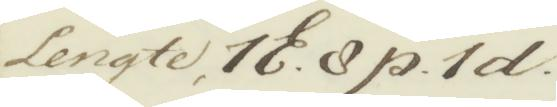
Lengte 1E. 8 p. 1d.
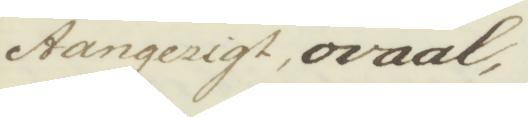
Aangezigt, ovaal,
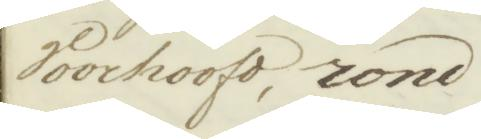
Voorhoofd, rond
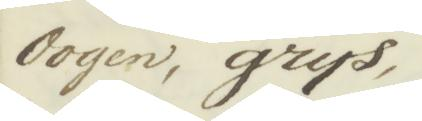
Oogen, grijs,
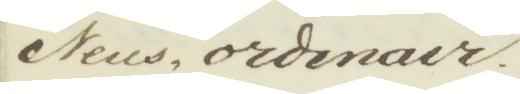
Neus, ordinair.
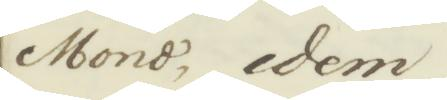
Mond, idem
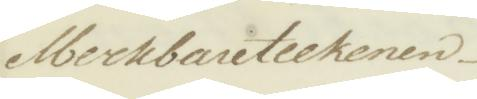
Merkbareteekenen.
